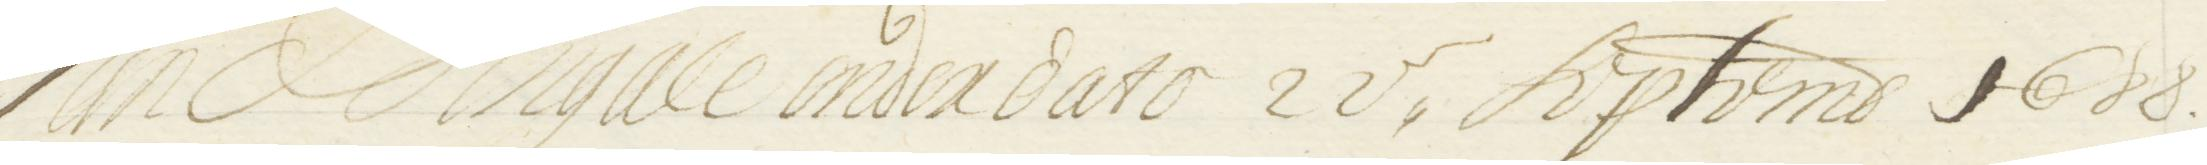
Van Bengale onder dato 22„' Septemb 1688.
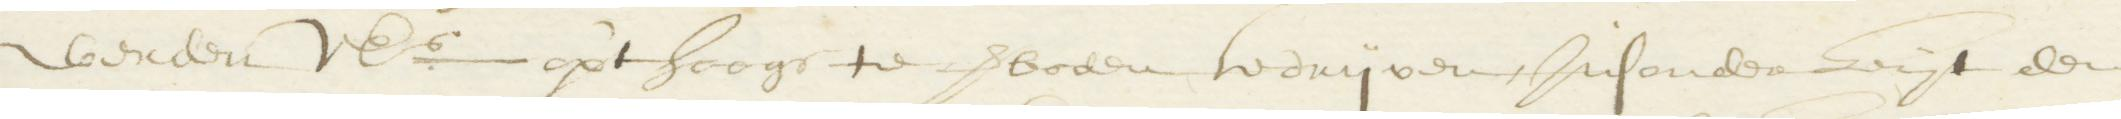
werden VE=s op't hoogste verboden te drijven, jnsonderheijt den
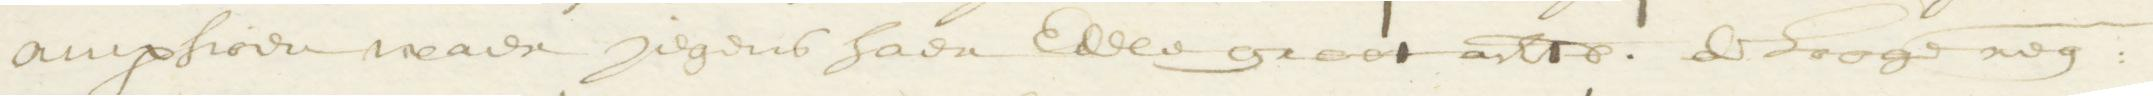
amphioen waer jegens haer Edele groot achtb. de hooge reg:
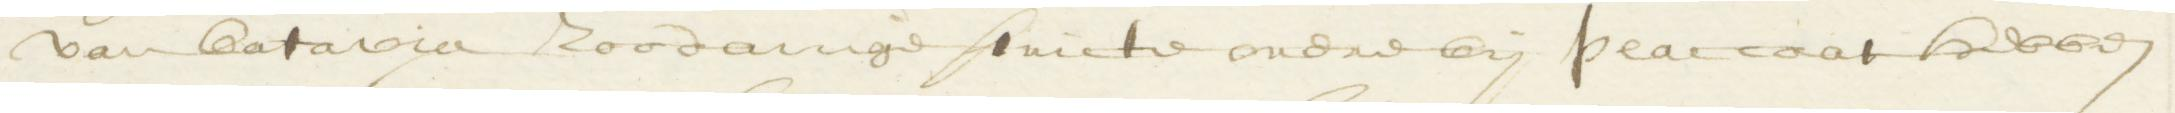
van batavia zoodanige stricte ordre bij placcaat hebben
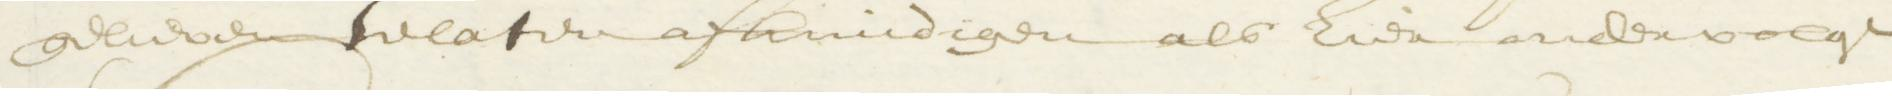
gelieven telaten afkondigen als hier onder volgt
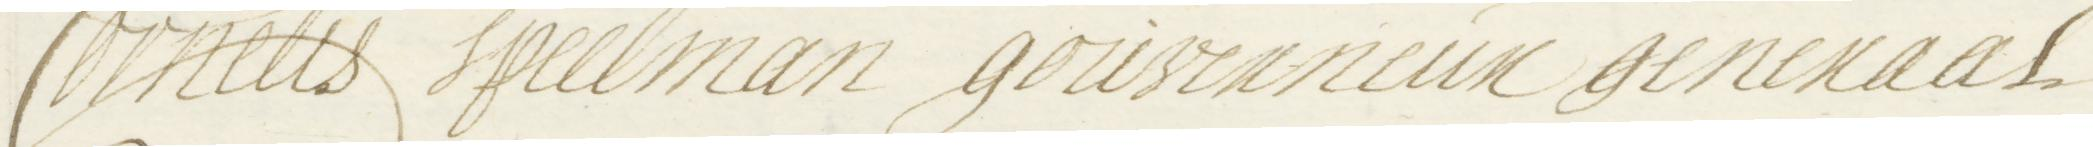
Cornelis speelman gouverneur generaal
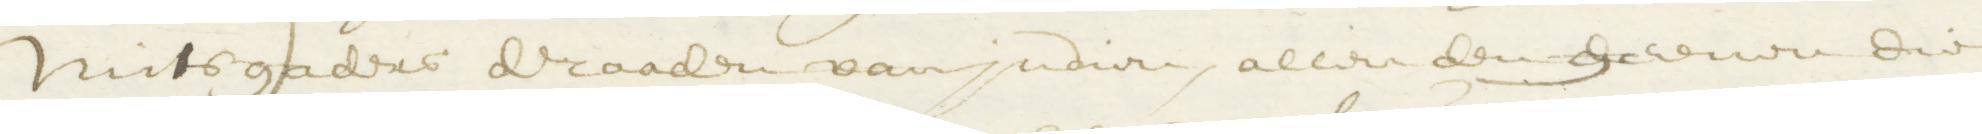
mitsgaders deraaden van jndien, allen den geenen die
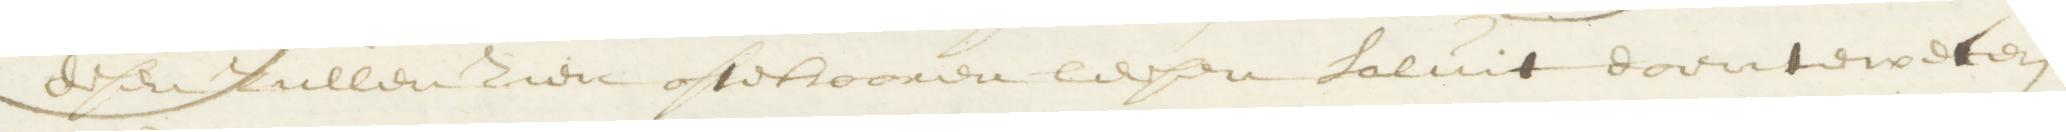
desen zullen zien oftehooren leesen saluit doen te weten
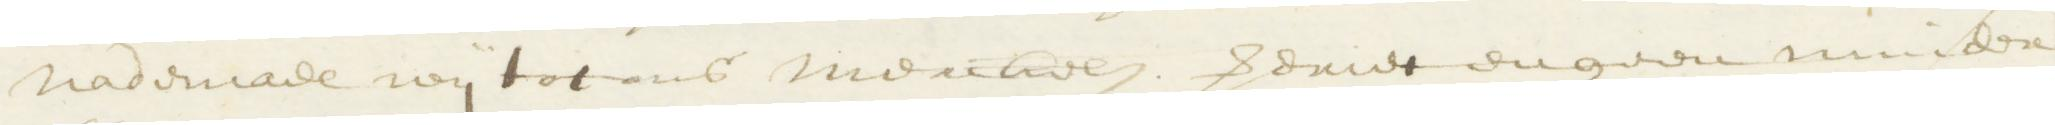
nademael wij tot ons merckelijk. verdriet en geen minder
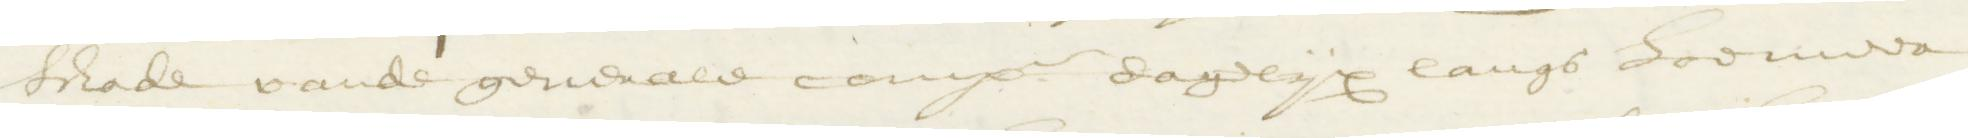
schade vande generale comp.' dagelijx langs hoe meer
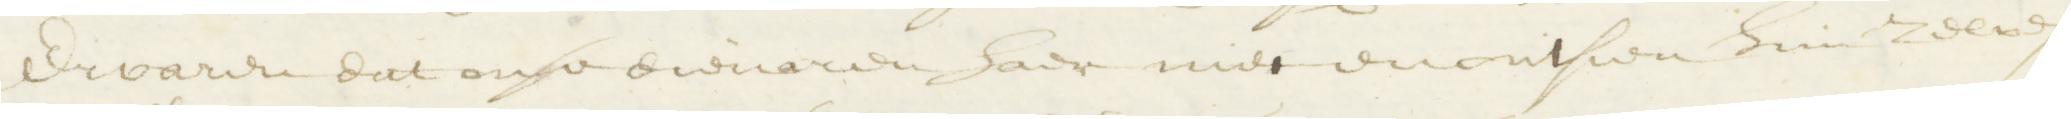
Ervaren dat onse dienaren haer niet en ontsien hun zelven
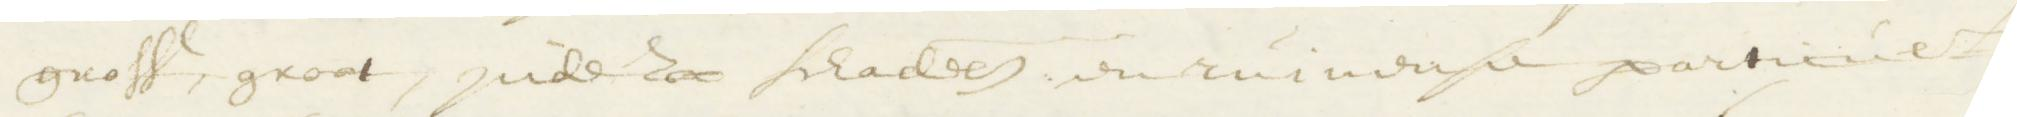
groffl, groot, jnde zo schadelijk: en ruineuse particul=e
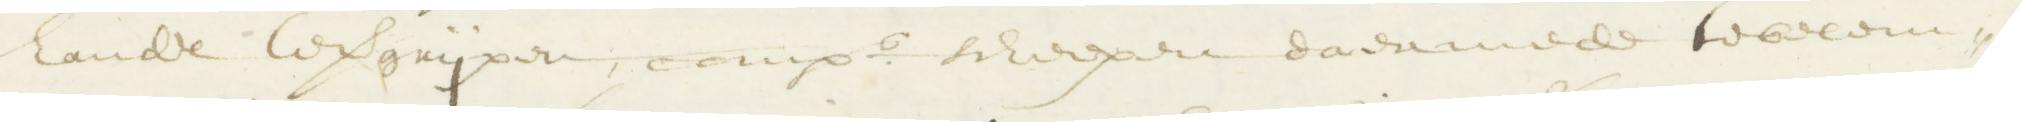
handel tevergrijpen; comp=s scheepen daermede te belem„
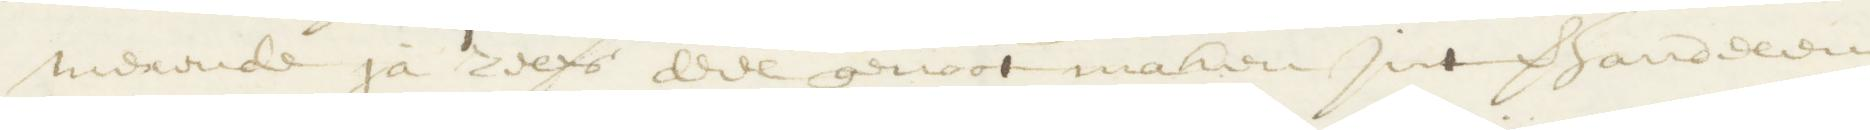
merende ja zelfs deel genoot maken jnt verhandelen
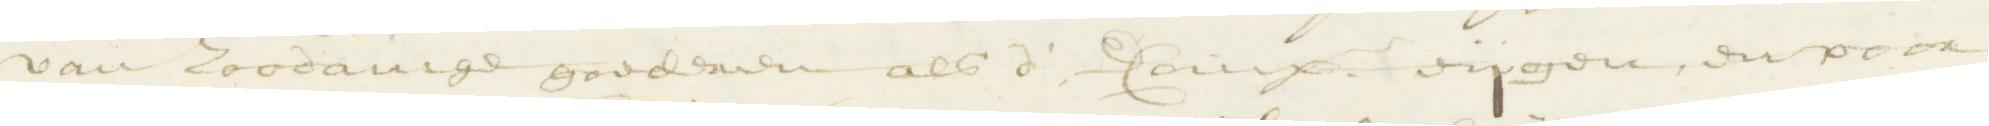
van zoodanige goederen als d' EComp eijgen, en voor
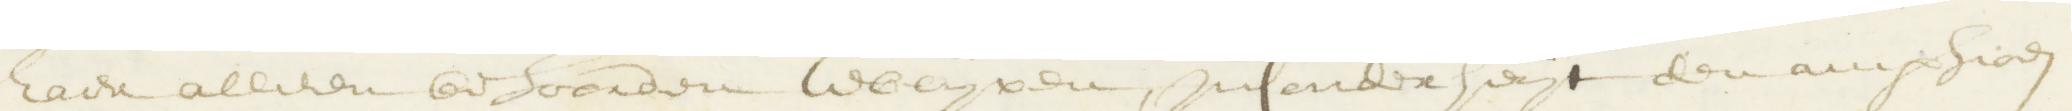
haer alleen behoorden teblijven, jnsonderheijt den amphioen
